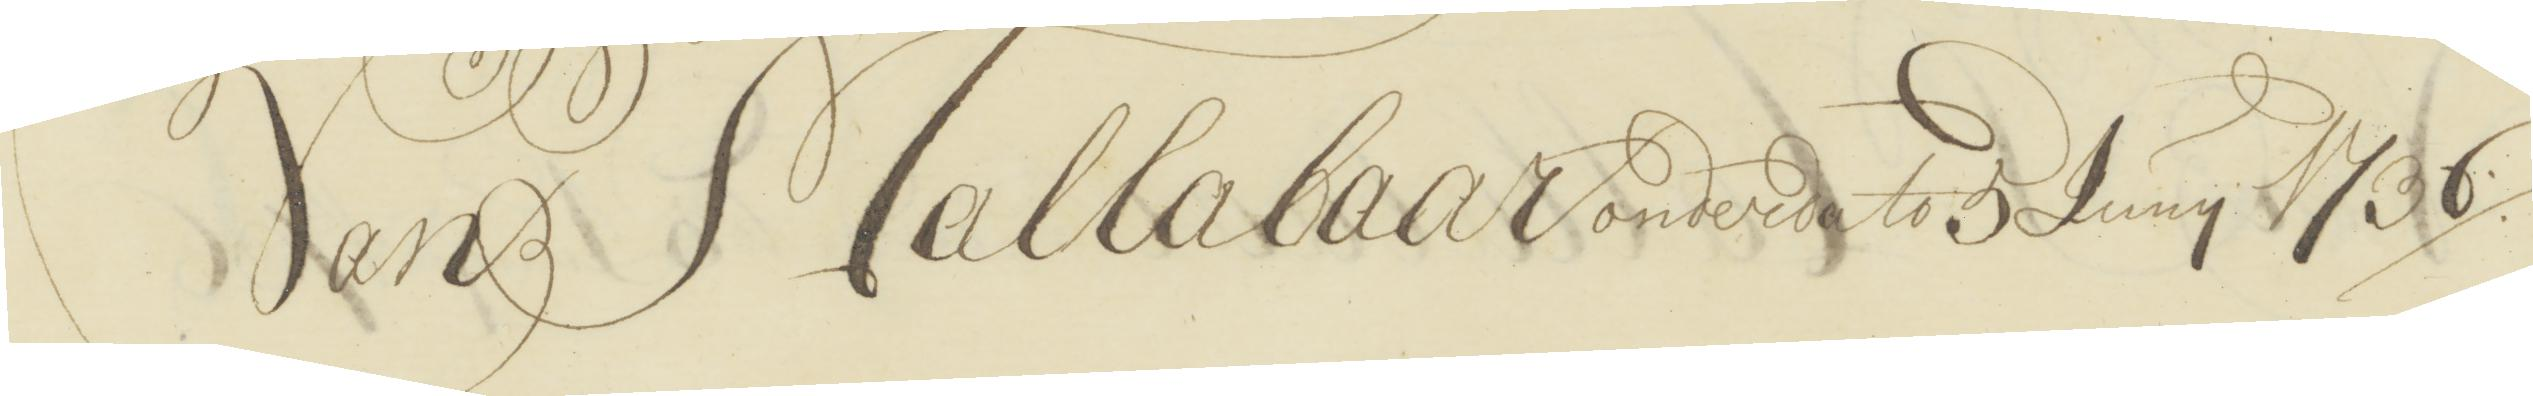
Van Mallabaar onderdato 3 Iunij 1736./.
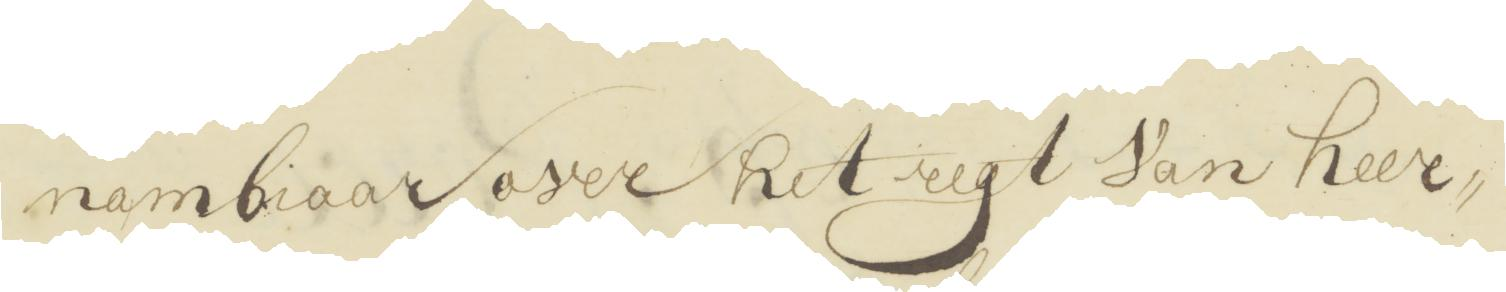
nambiaar over het regt van heer„
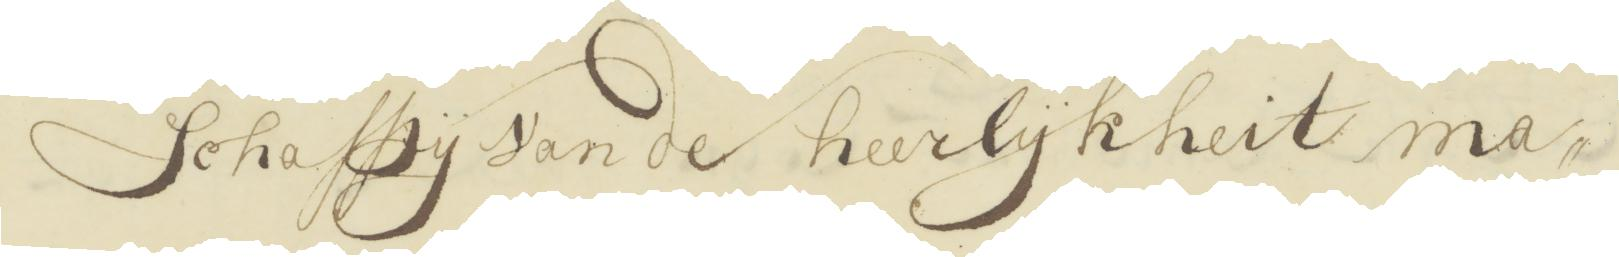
schappij van de heerlijkheit ma„
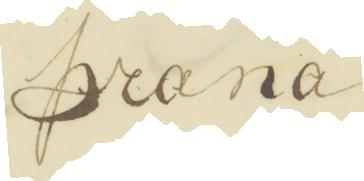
prana
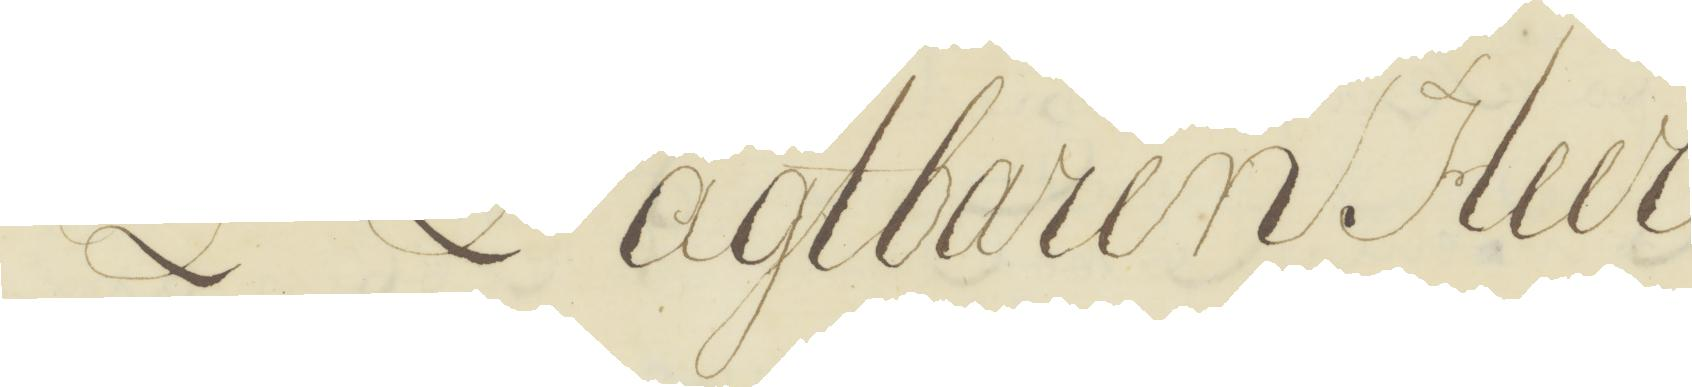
E E agtbaren Heer
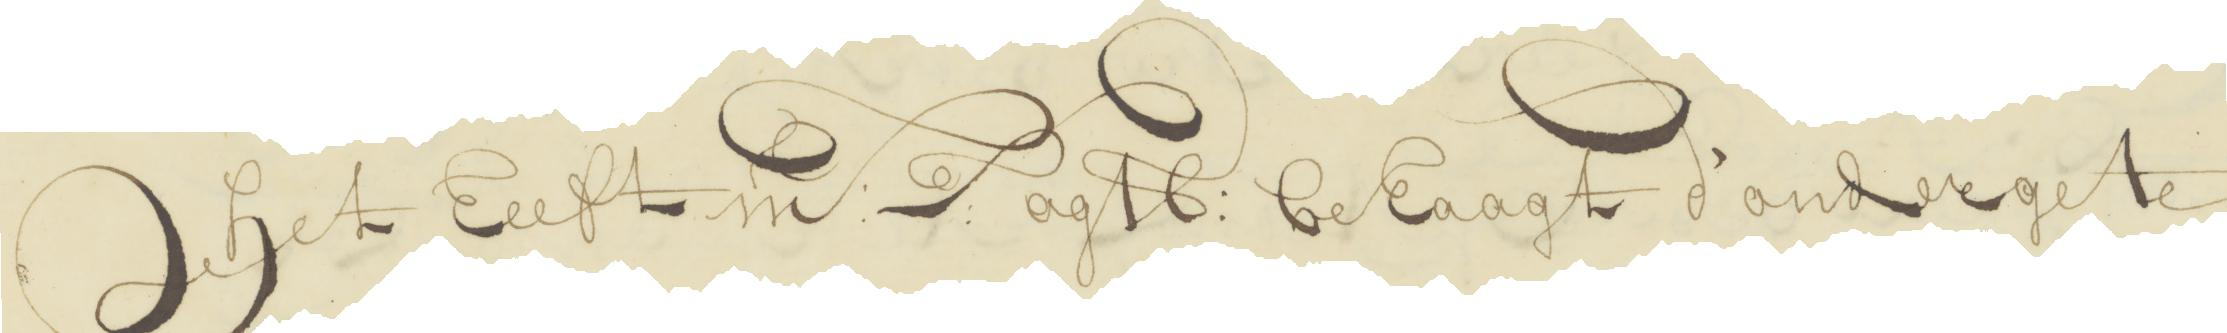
Het heeft uE E: agtb: behaagt d'ondergete
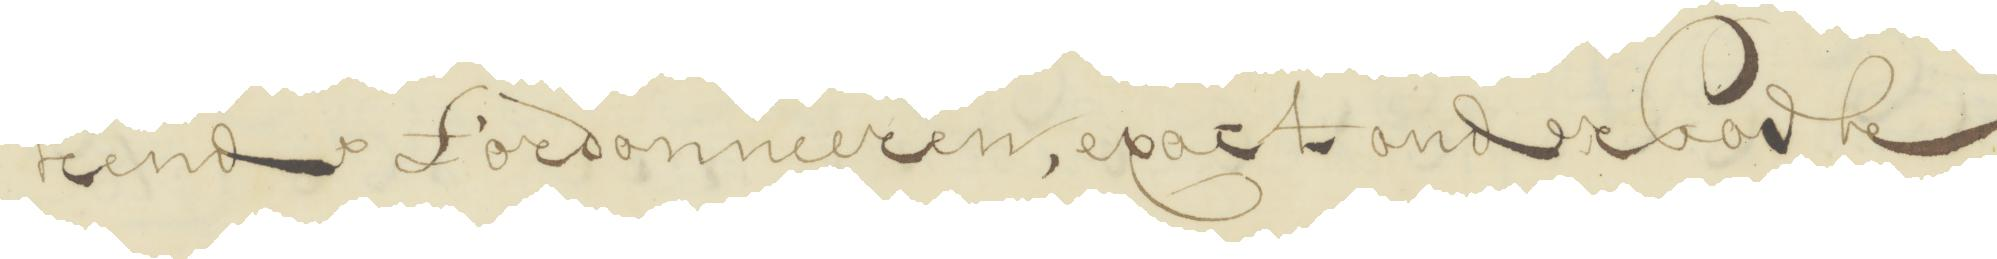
kende t' ordonneeren, exact onderboek
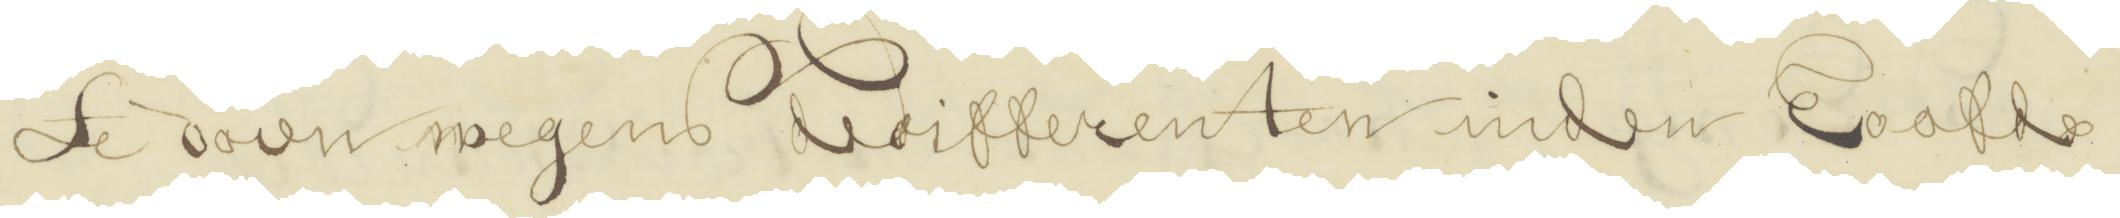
te doen wegens de differenten inden hoofde
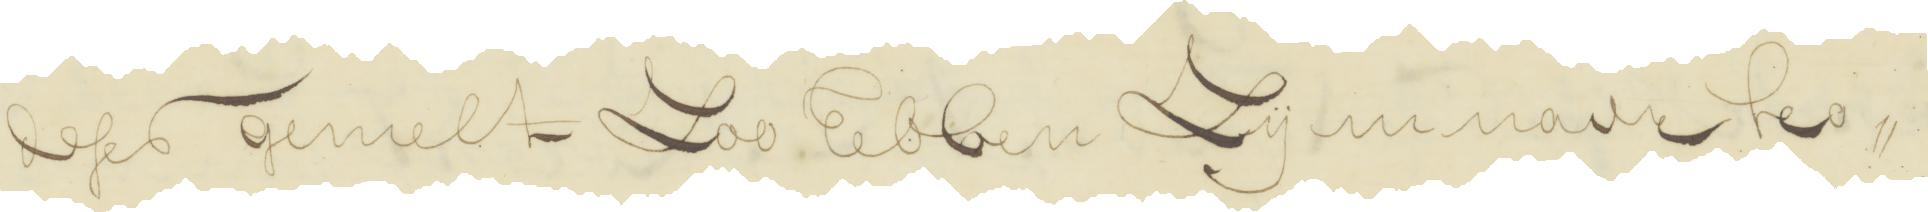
deses gemelt zoo hebben zij nu naer ko„
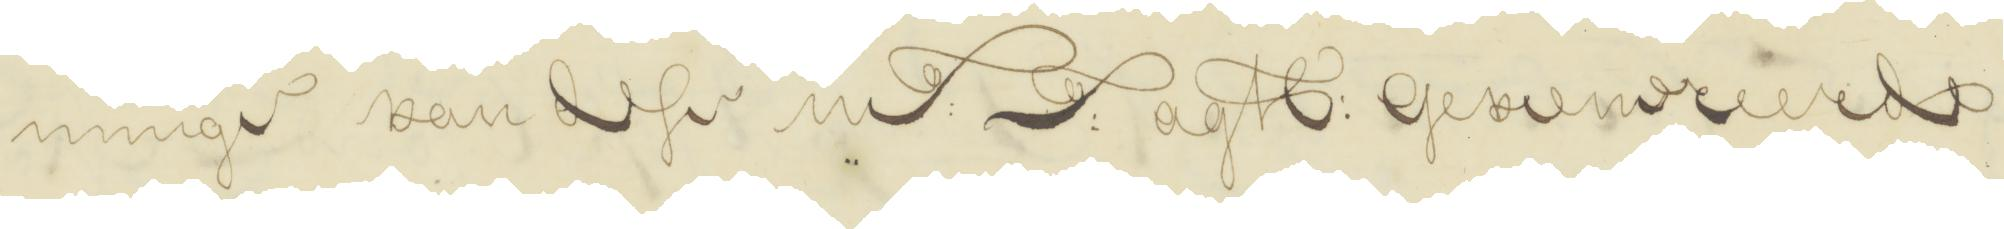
ninge van dese uE: E: agtb: gevenereerde
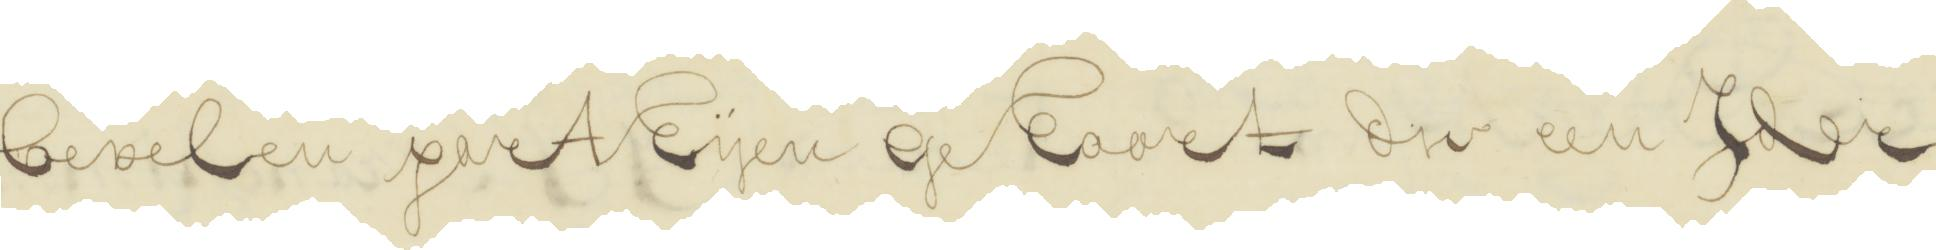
bevelen parthijen gehoort die een Jder
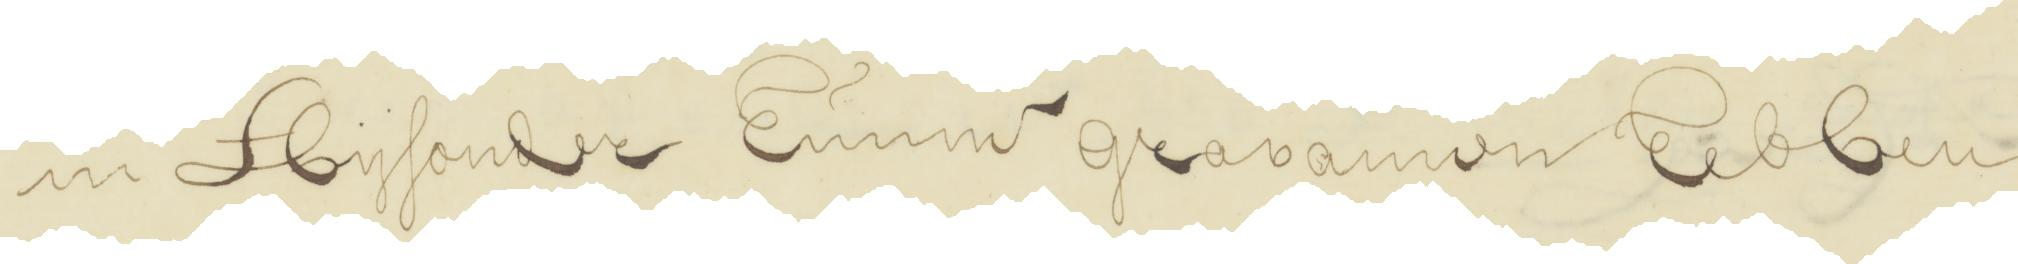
in tbijsonder hunne gravamen hebben
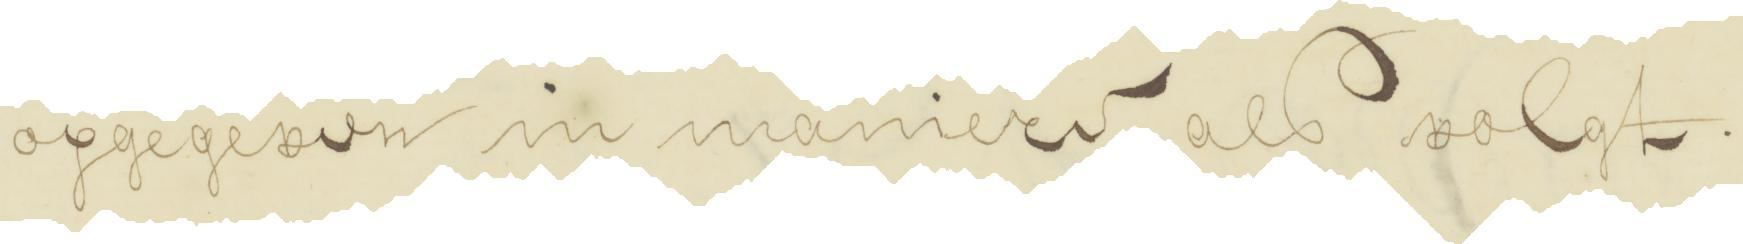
opgegeven in maniere als volgt.
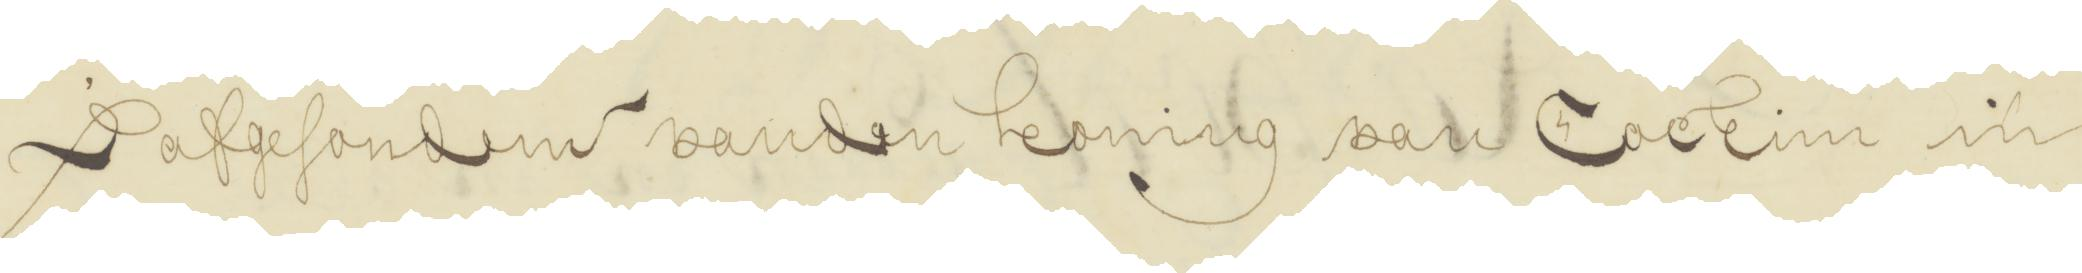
te afgesondene van den koning van Cochim in
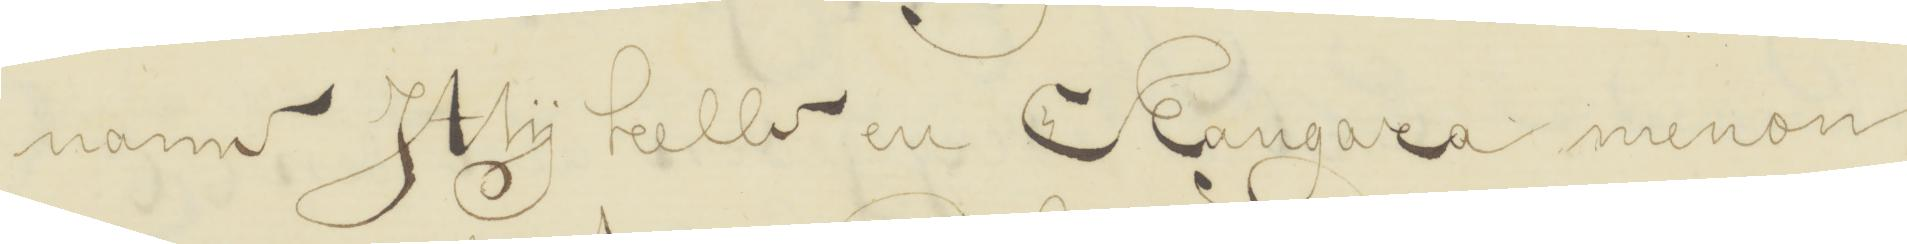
name Jttij kelle en changara menon
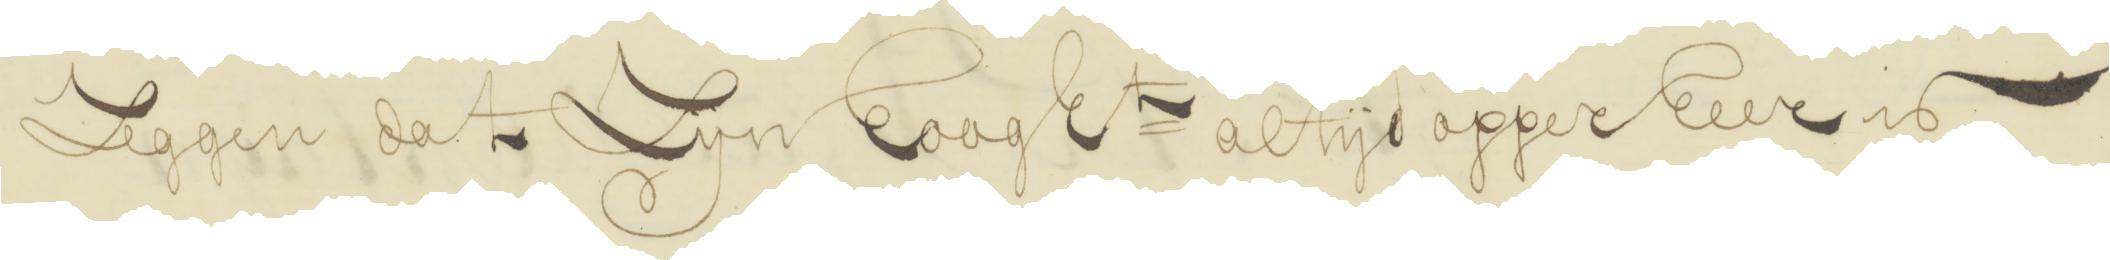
zeggen dat zijn hoogh=t altijd opperheer is
